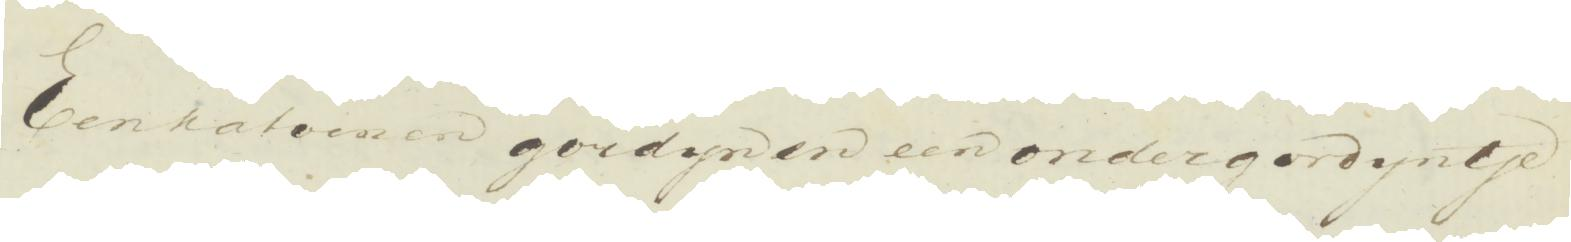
Een katoenen gordyn en een ondergordyntje
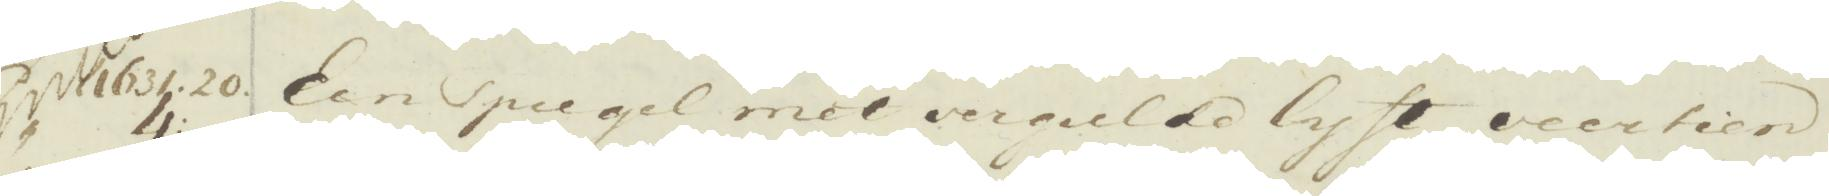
„ 4631.20. Een spiegel met vergulde lyst, veertien
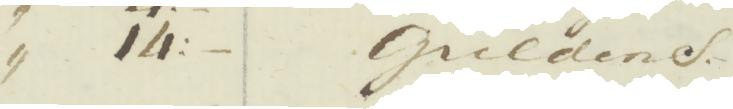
14: Guldens.
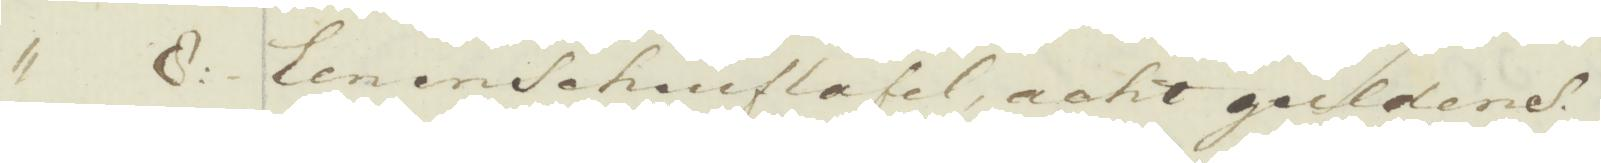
„ 8:- Een inschuiftafel, acht guldens.
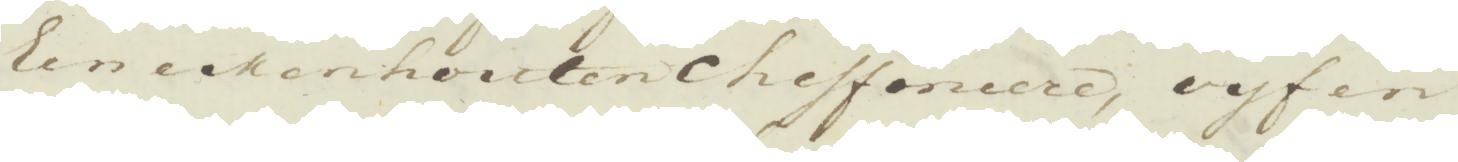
Een eikenhouten chiffoniere, vyf en
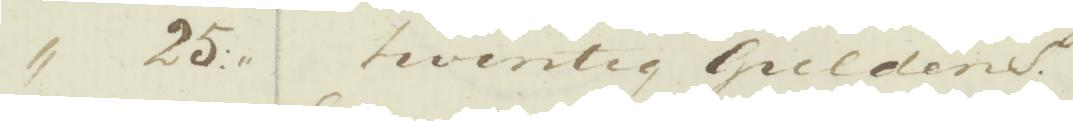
„ 25:„ twintig Guldens.
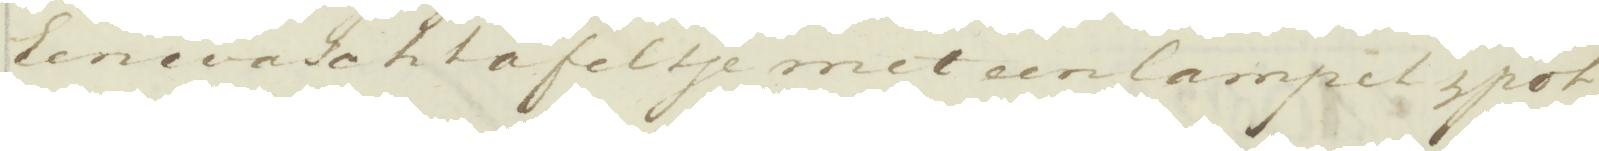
Een waschtafeltje met een lampet en pot
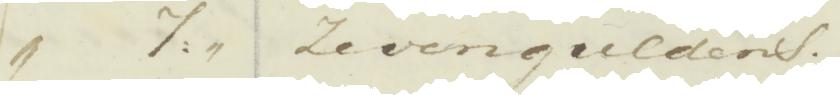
„ 7:„ zeven guldens.
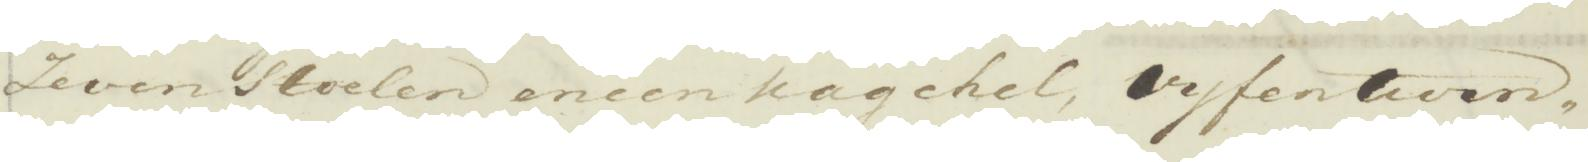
zeven stoelen en een kagchel, vijfentwin,
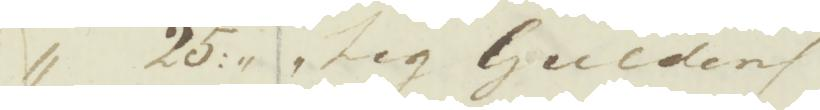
„ 25:„ „tig Guldens
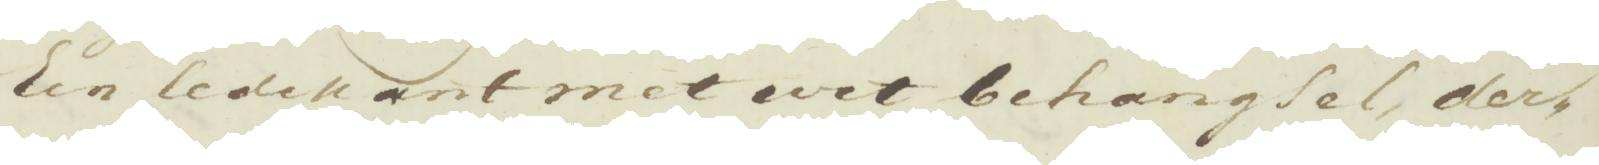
Een ledikant met wit behangsel, der„
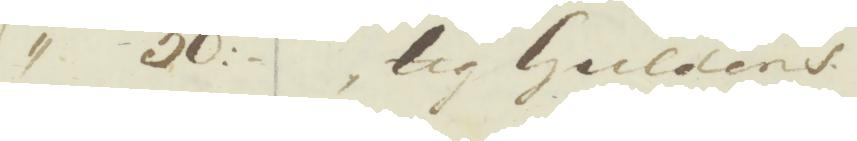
„ 30:- „tig Guldens.
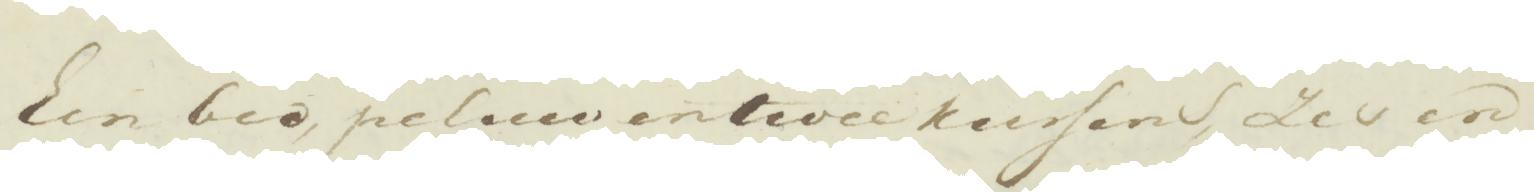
Een bed, peluw en twee kussens, zes en
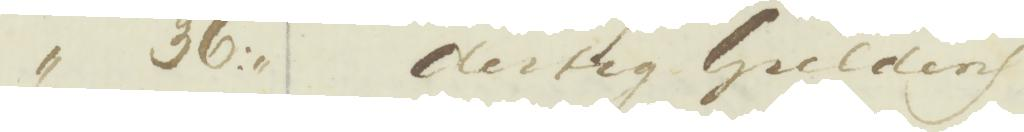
„ 36:„ dertig Guldens
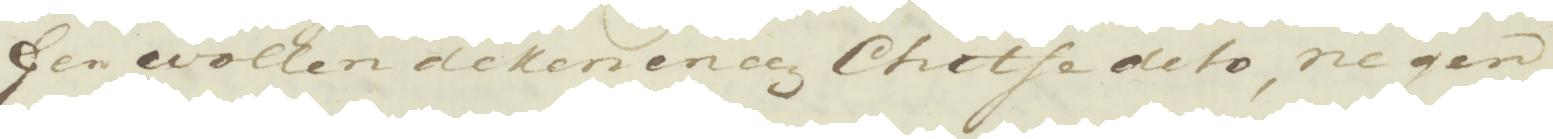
Een wollen deken en een Chitse dito, negen
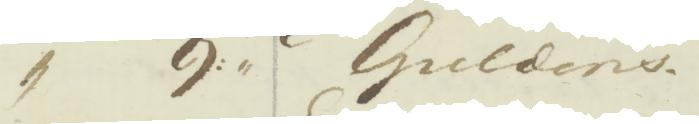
„ 9:„ Guldens.
